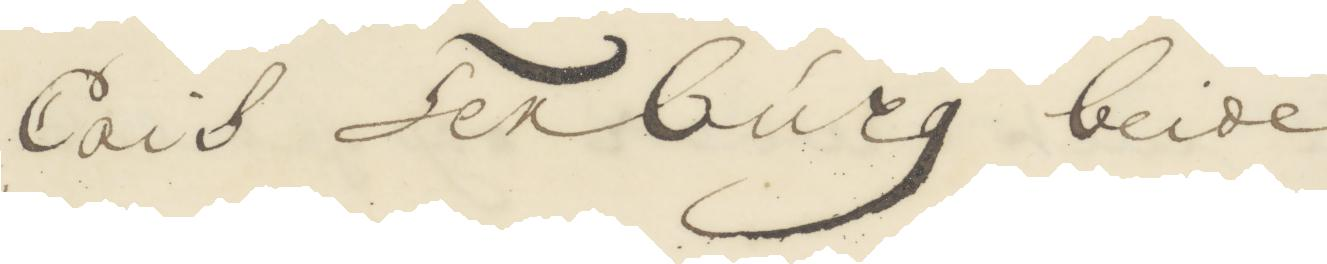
cois Terburg beide
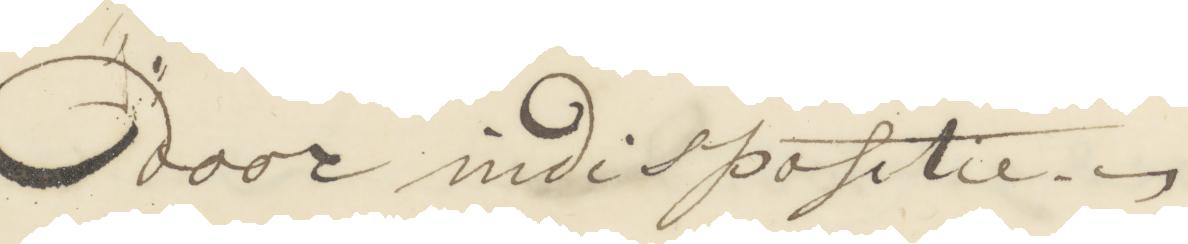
door indispositie.—
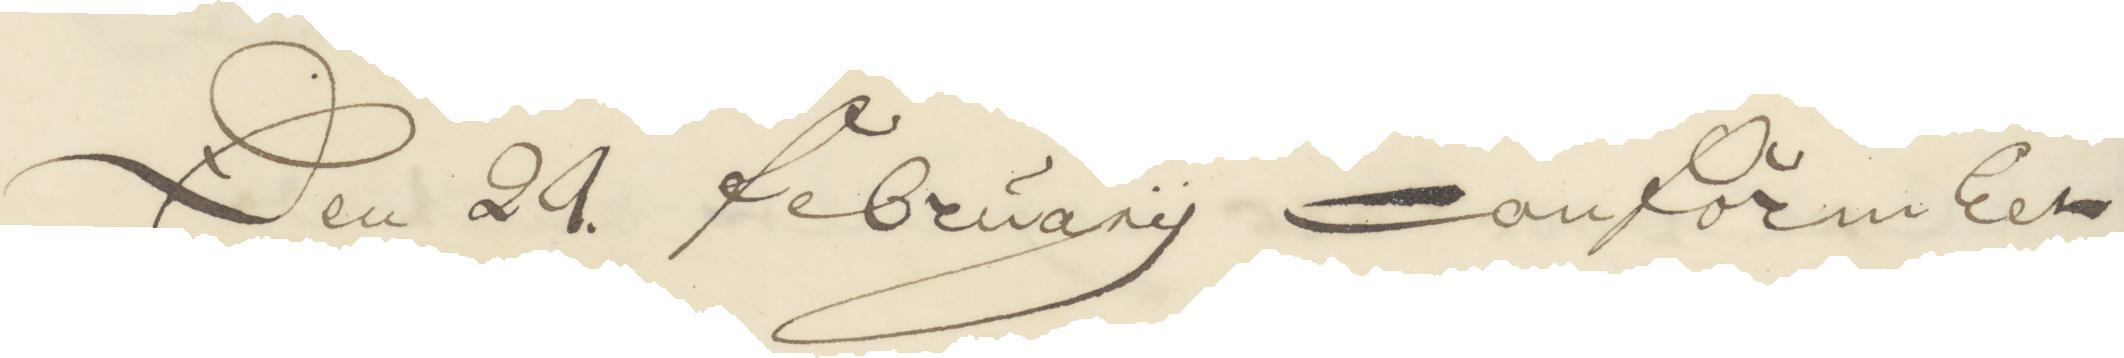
Den 24. februarij conform het
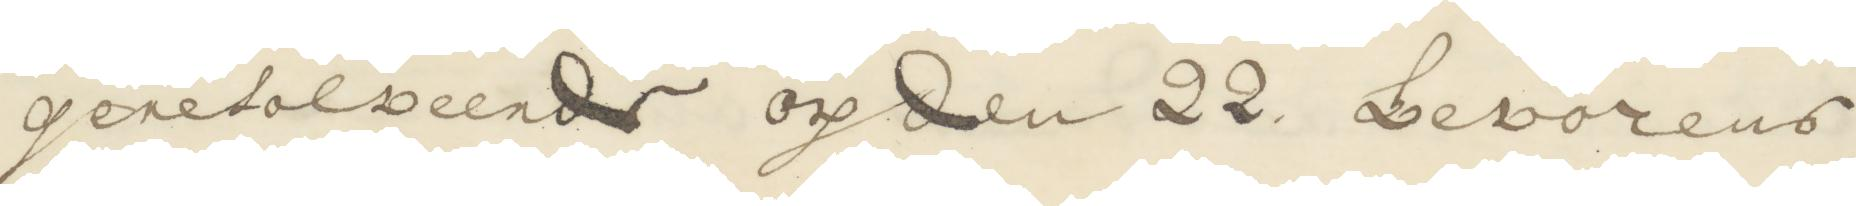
geresolveerde op den 22. bevorens
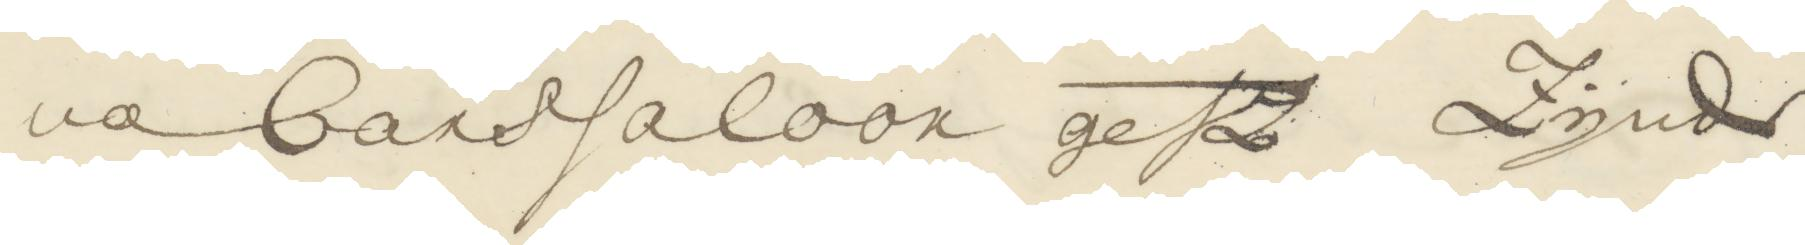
na barssaloor gesz: zijnde
